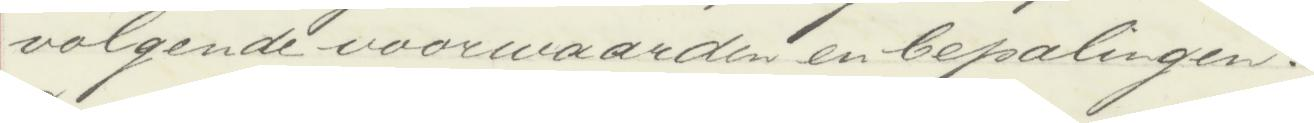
volgende voorwaarden en bepalingen:
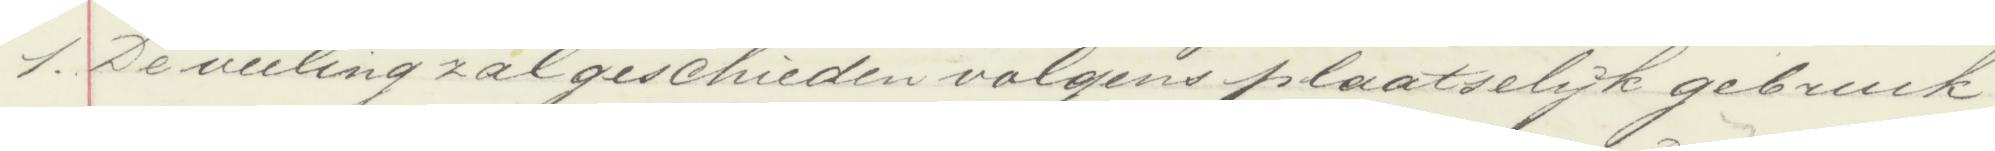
1. De veiling zal geschieden volgens plaatselijk gebruik
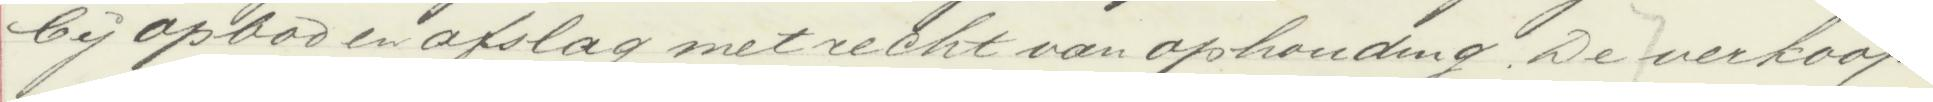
bij opbod en afslag met recht van ophouding, De verkoop
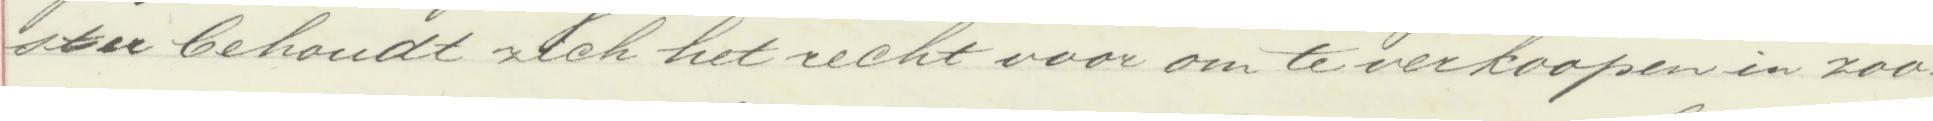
ster behoudt zich het recht voor om te verkoopen in zoo
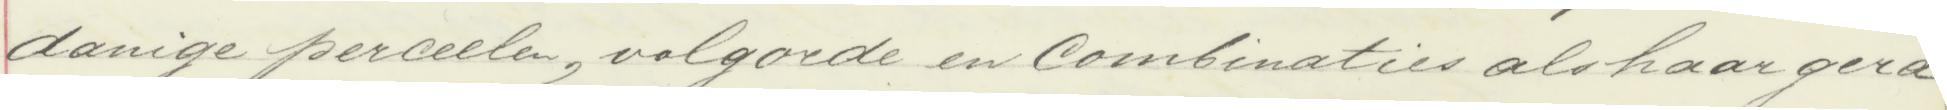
danige perceelen, volgorde en combinaties als haar gera
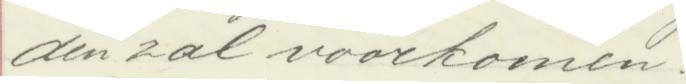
den zal voorkomen
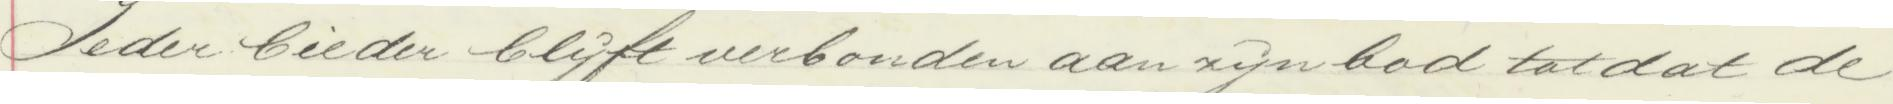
Ieder bieder blijft verbonden aan zijn bod tot dat de
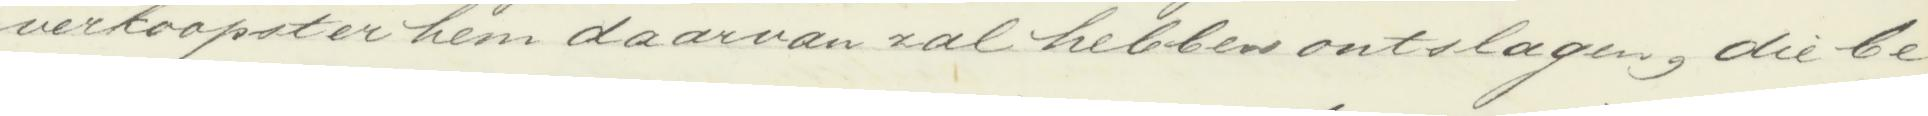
verkoopster hem daarvan zal hebben ontslagen, die be
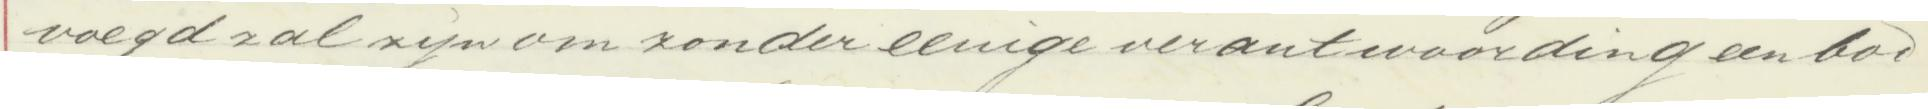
voegd zal zyn om zonder eenige verantwoording een bod
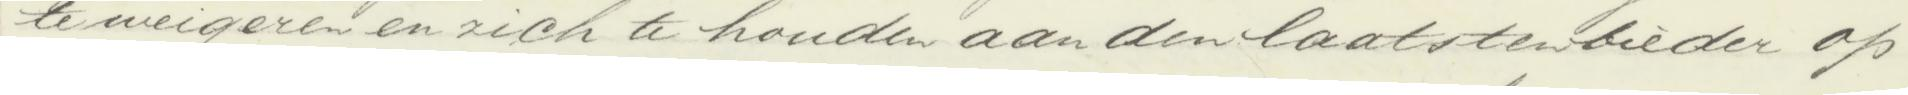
te weigeren en zich te houden aan den laatsten bieder op
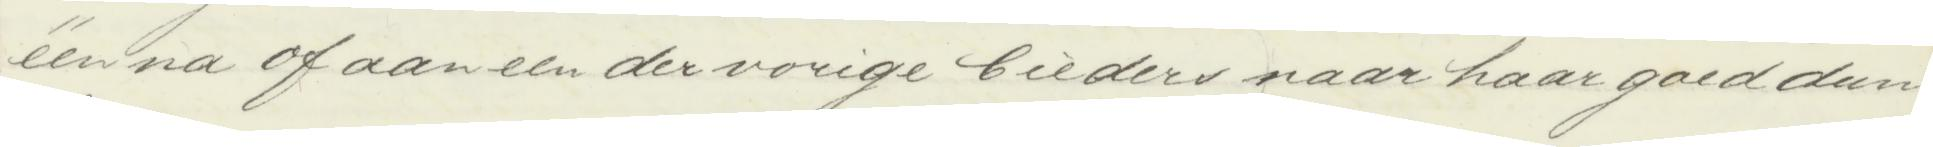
één na of aan een der vorige bieders naar haar goed dun
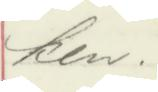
ken.
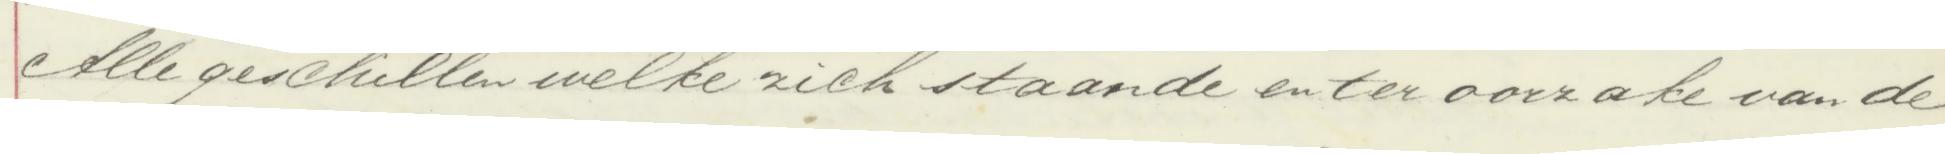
Alle geschillen welke zich staande en ter oorzake van de
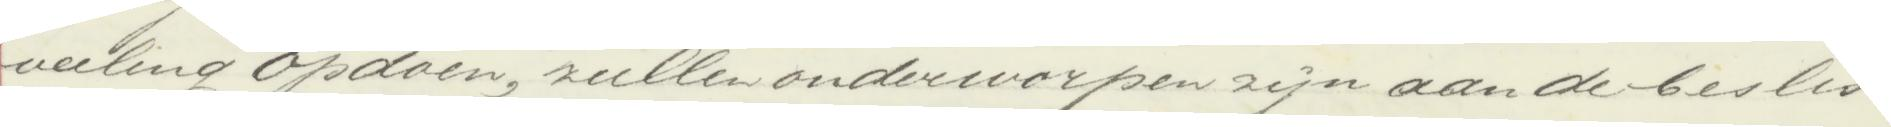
veiling opdoen, zullen onderworpen zijn aan de beslis-
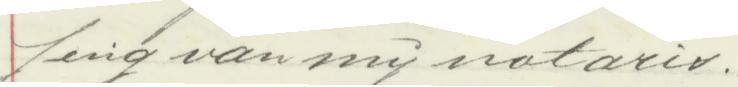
sing van mij notaris.
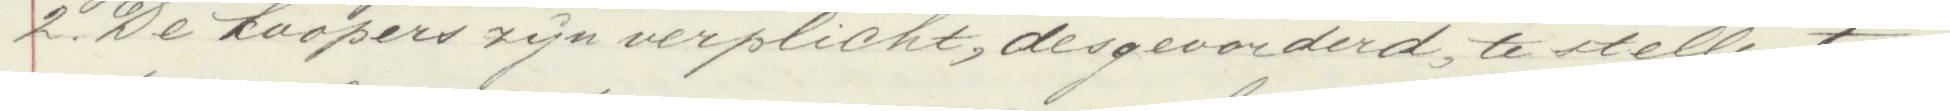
2. De koopers zijn verplicht, desgevorderd, te stellen twee
